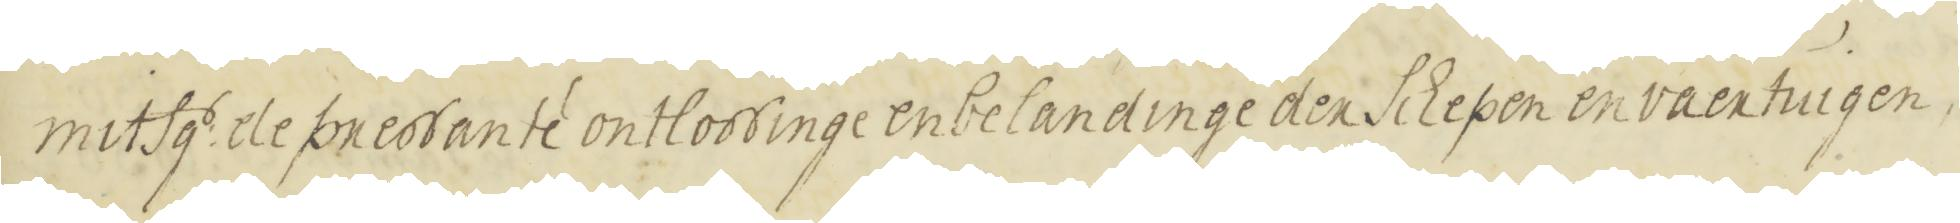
mitsg:s de pressante ontlossinge en belandinge der schepen en vaertuigen,
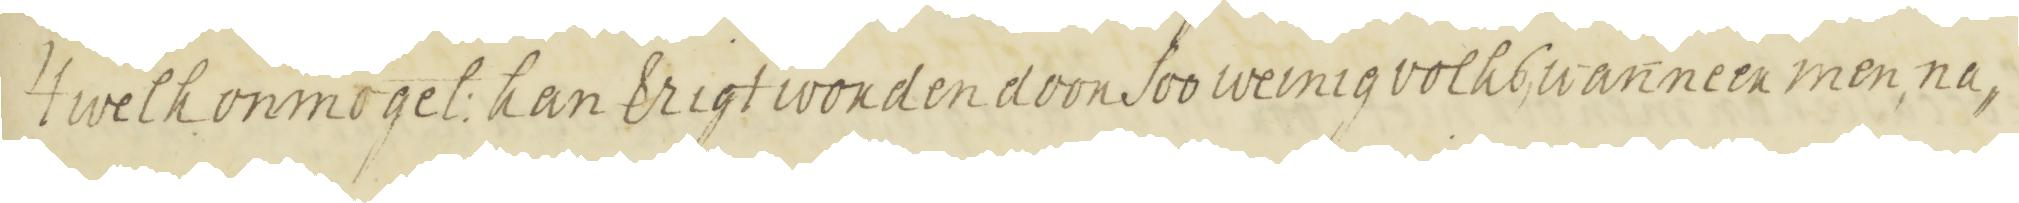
’t welk onmogel: kan verrigt worden door soo weinig volks wanneer men, na„
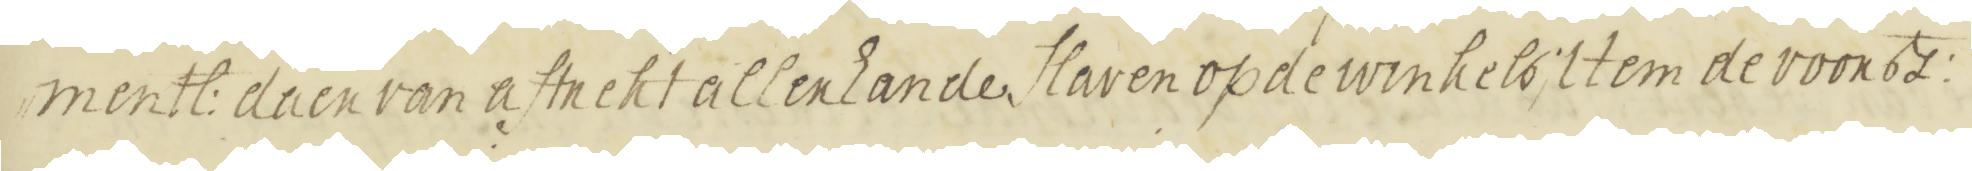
„mentl: daer van aftrekt allerhande slaven op de winkels, Item de voorsz:
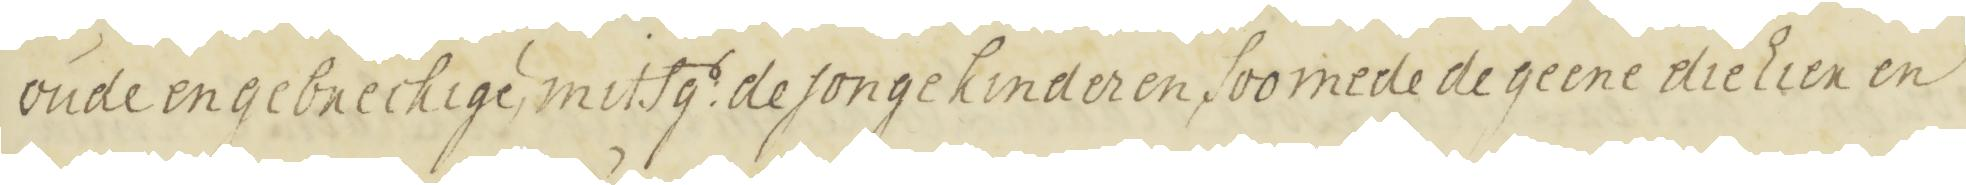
oude en gebreckige, mitsg:s de jonge kinderen, soo mede de geene die hier en
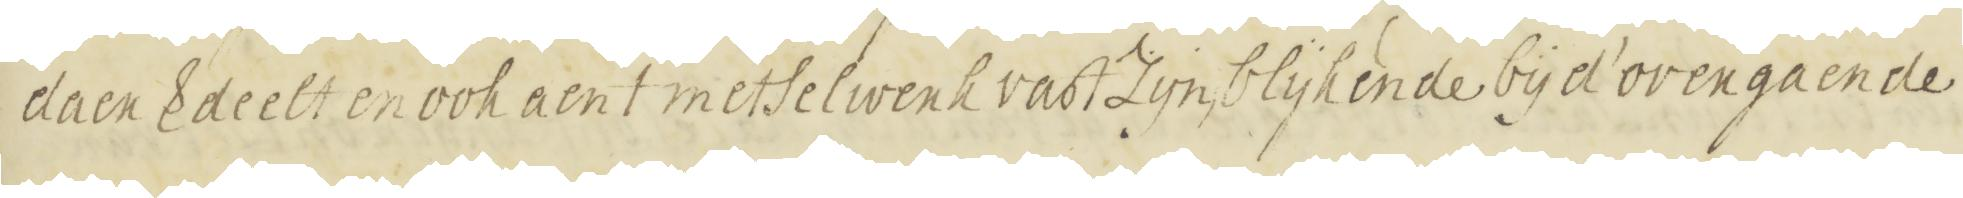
daer verdeelt en ook aen 't metselwerk vast zijn, blijkende bij d’ overgaende
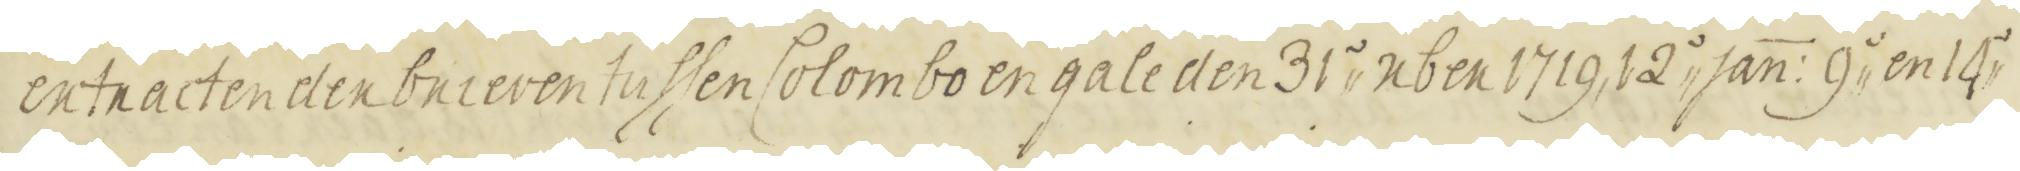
extracten der brieven tussen Colombo en gale den 31„' xber 1719, 12„e Jan: 9„' en 14„'
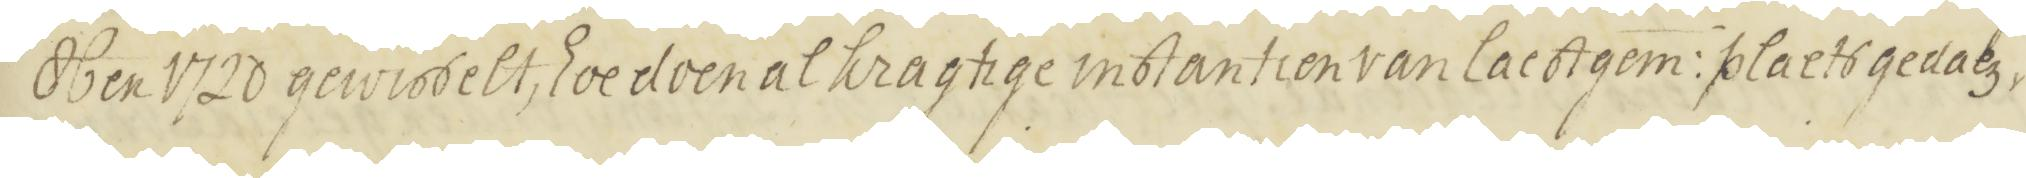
8ber 1720 gewisselt, hoe doen al kragtige instantien van laest gem: plaets gedaen
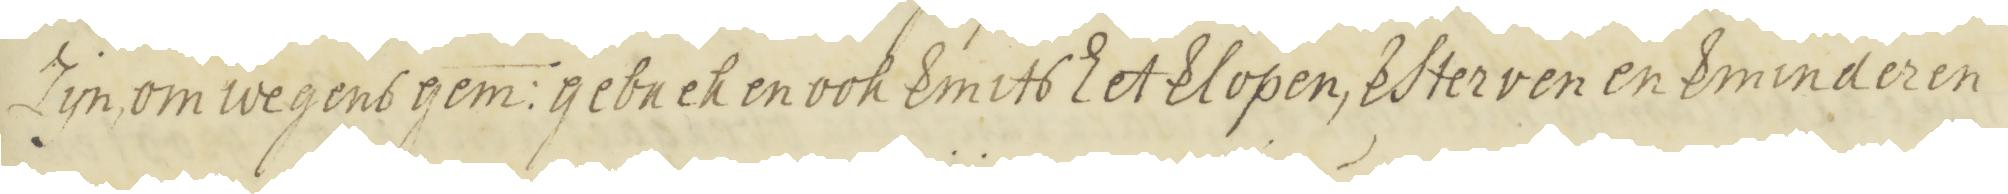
zijn, om wegens gem: gebrek en ook vermits het verlopen, versterven en verminderen
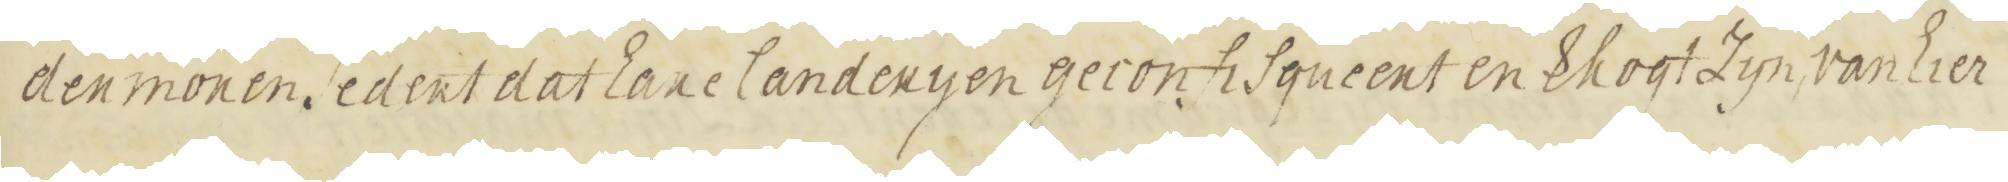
der moren sedert dat hare landerijen geconfisqueert en verkogt zijn, van hier
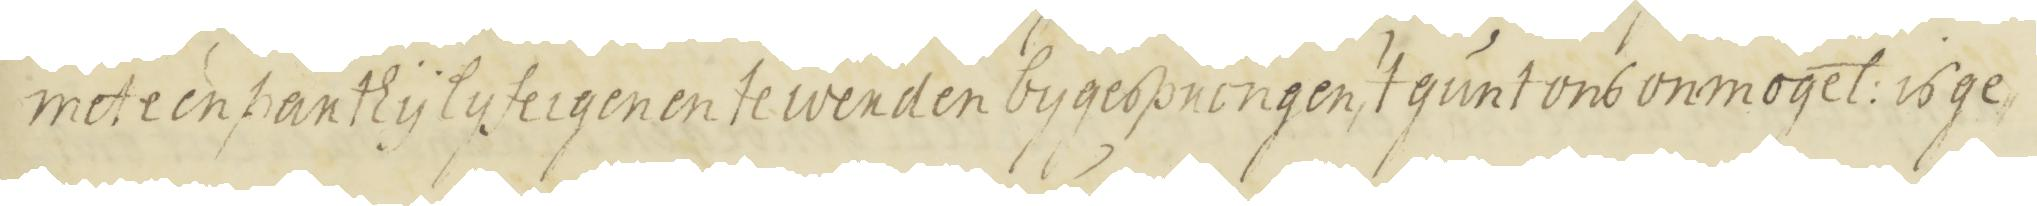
met een panthij lyfeigenen te werden bygesprongen, ’t gunt ons onmogel: is ge„
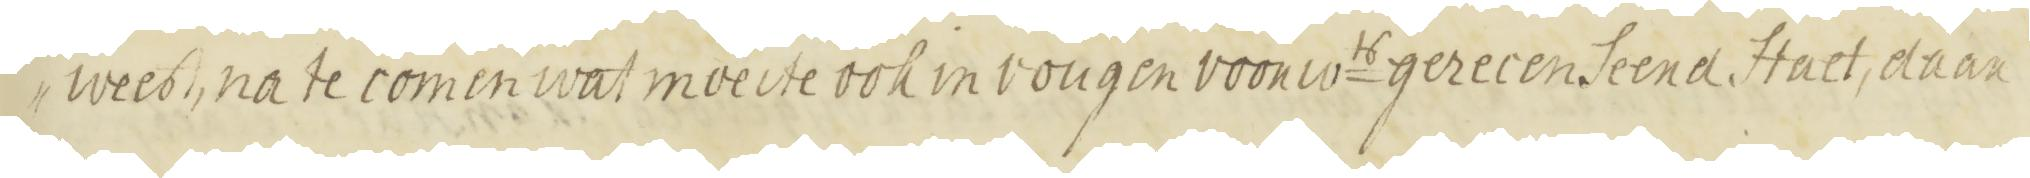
„weest, na te comen wat moeite ook in vougen voorw=ts gerecenseerd staet, daar
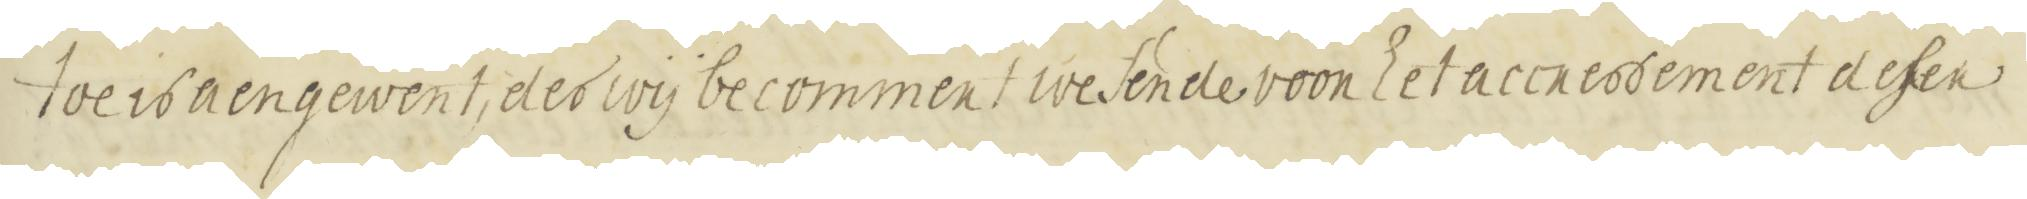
toe is aengewent, des wij becommert wesende voor het accressement deser
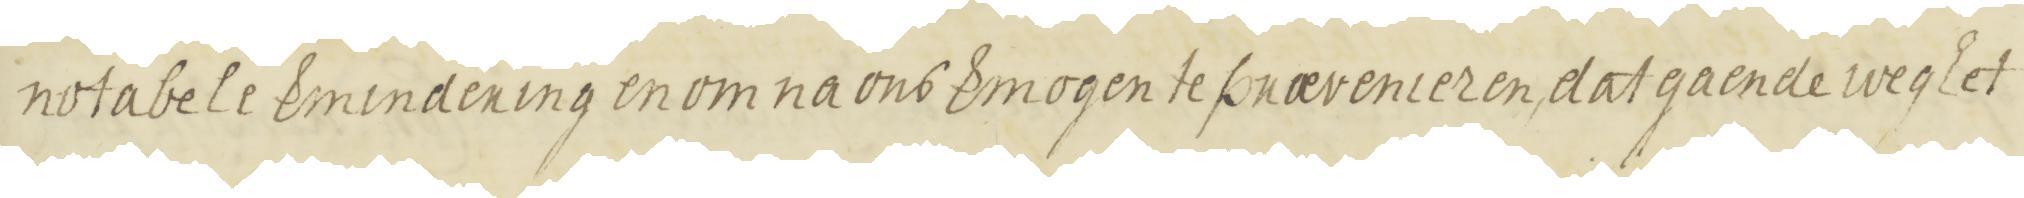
notabele vermindering en om na ons vermogen te praevenieren, dat gaende weg het
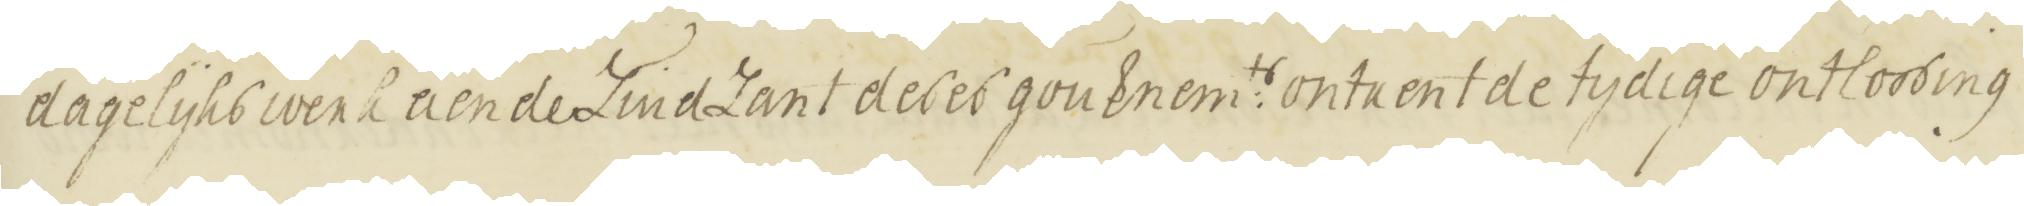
dagelijks werk aen de zuidzant deses gouvernem:ts ontrent de tydige ontloosing
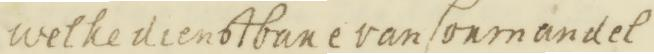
welke dienstbare van Cormandel
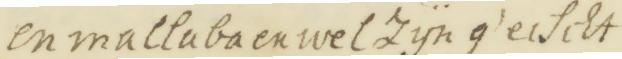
en mallabaer wel zijn g’eischt
